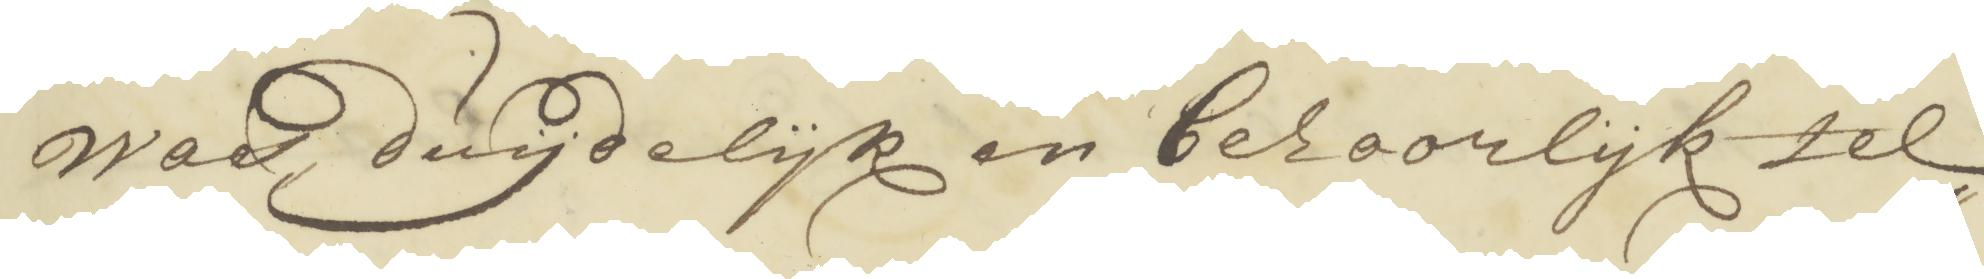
was, duijdelijk en behoorlijk tel„
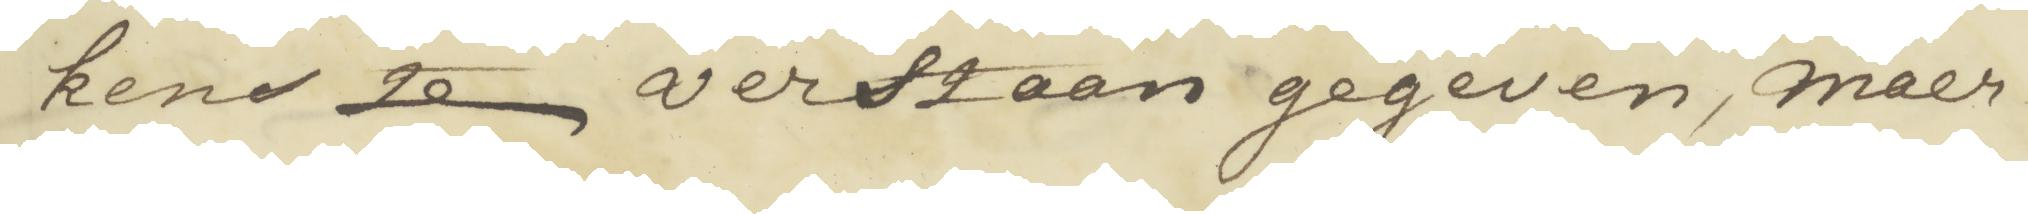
kens te verstaan gegeven, maer
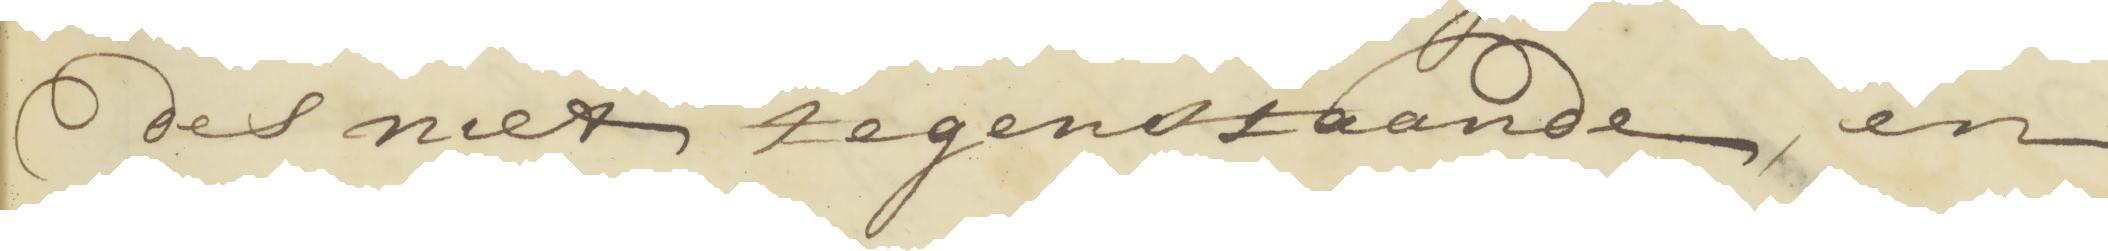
des niet tegenstaande, en
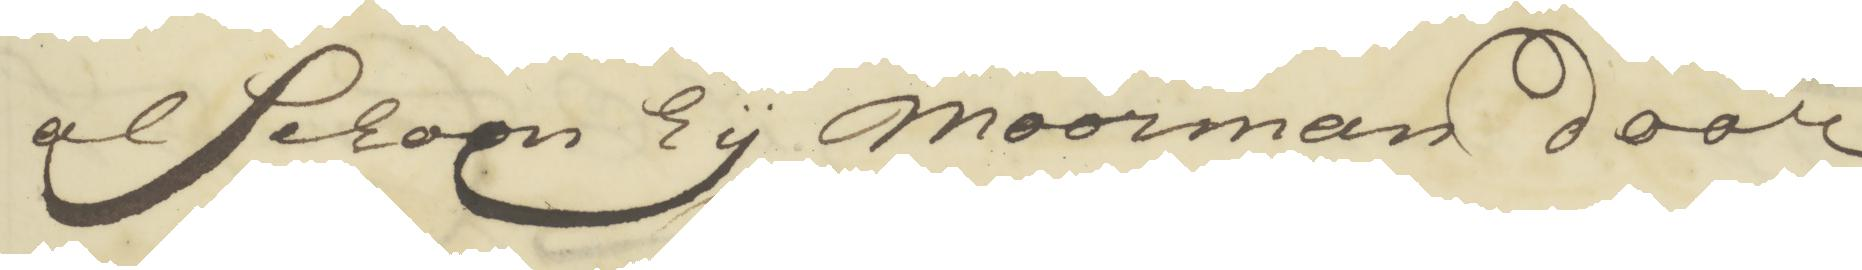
alschoon hij moorman door
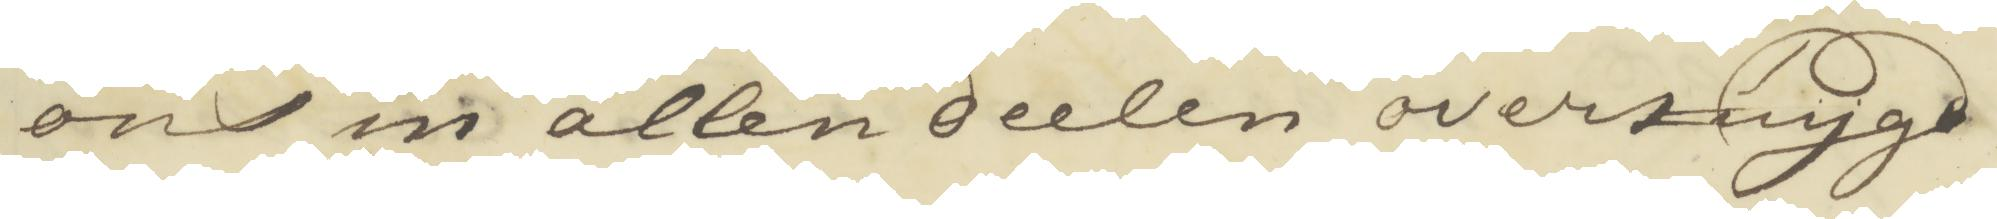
ons in allen deelen overtuijgd
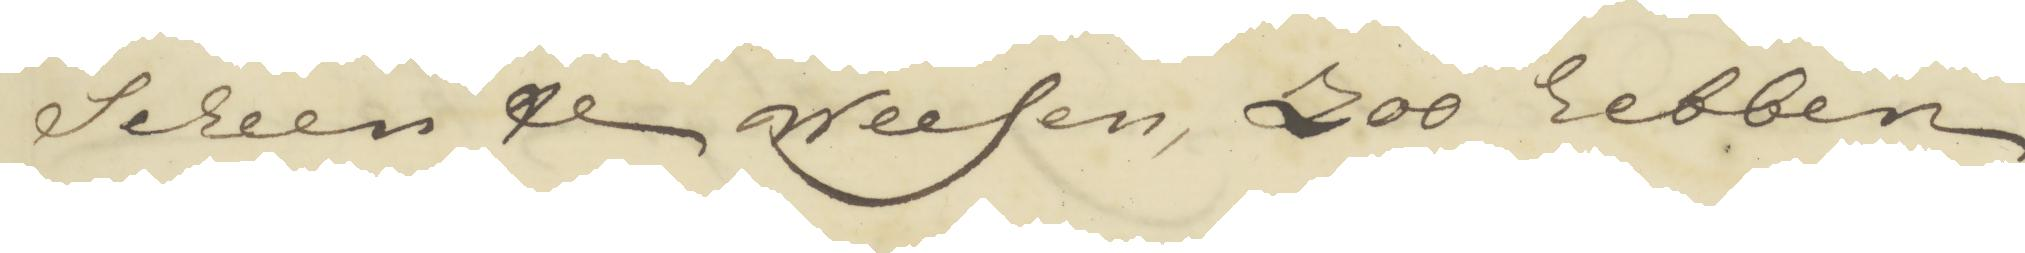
scheen te weesen, zoo hebben
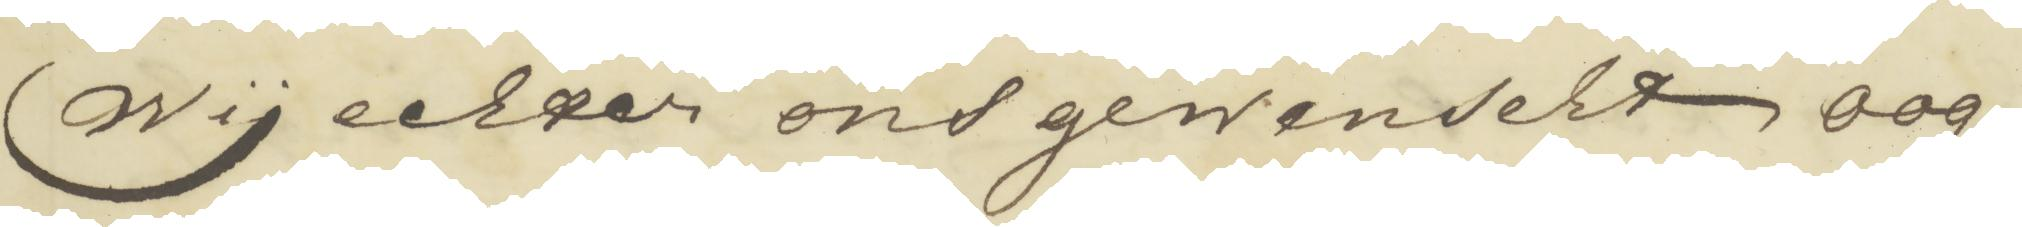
wij echter ons gewenscht oog
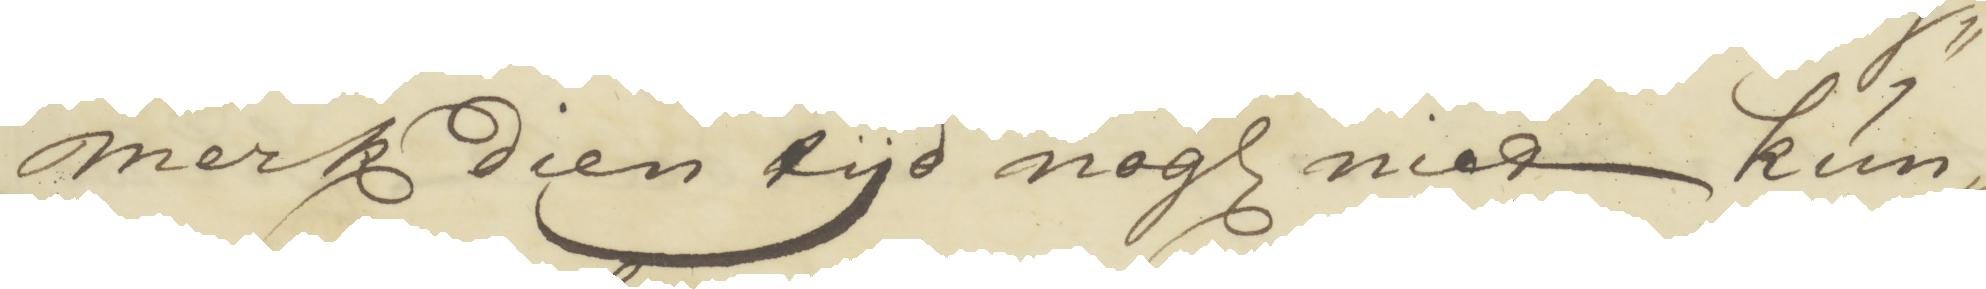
merk dien tijd nogh niet kun„
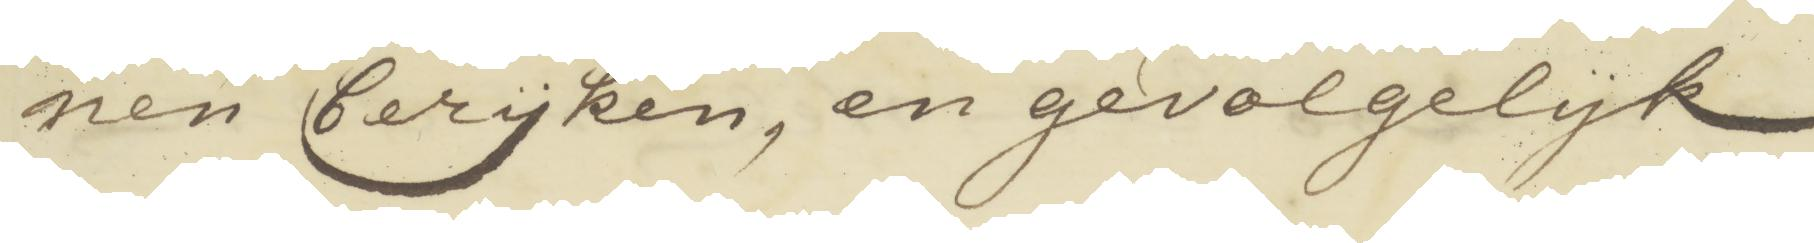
nen berijken, en gevolgelijk
